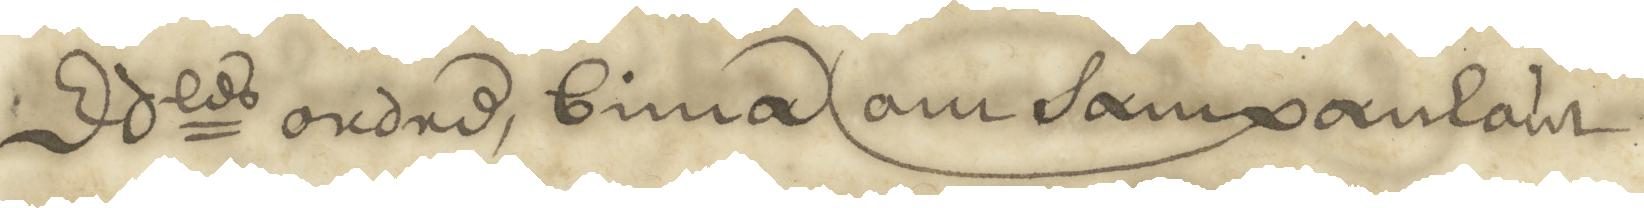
Ed=les ordre, bima om sampanhout
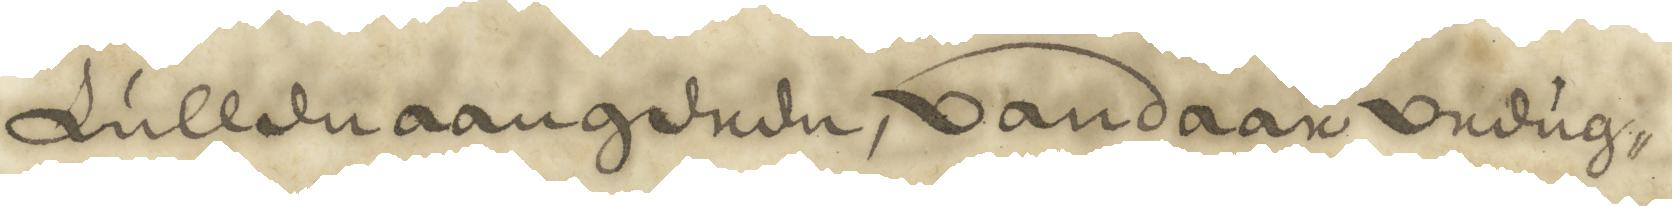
zullen aangeren, van daar vreug„
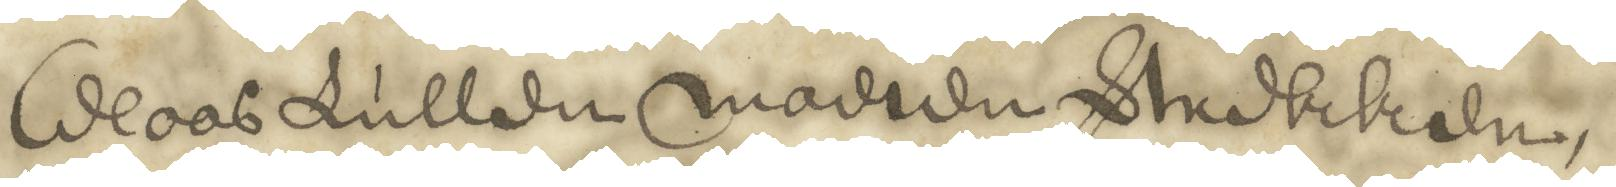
teloos zullen moeten vertrekken,
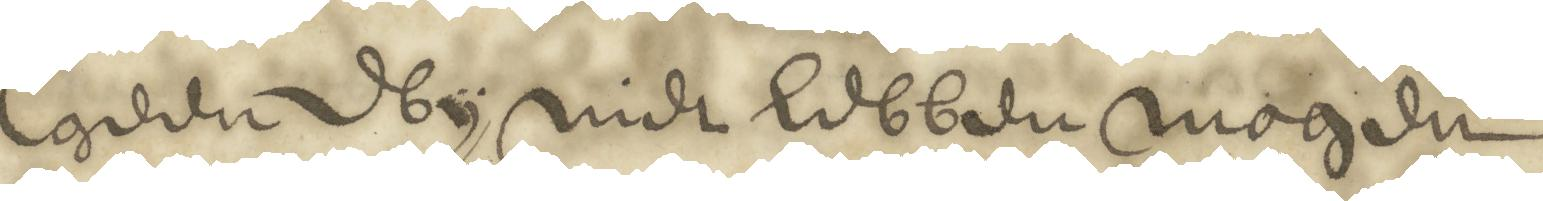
'tgeen wij niet hebben mogen
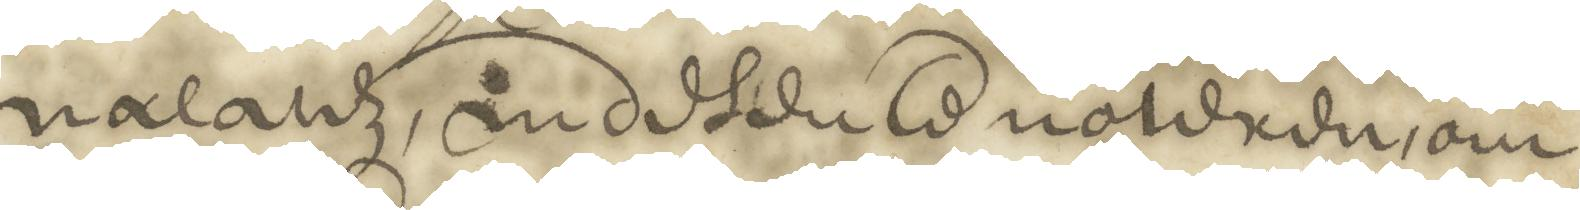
nalaten, in desen te noteren, om
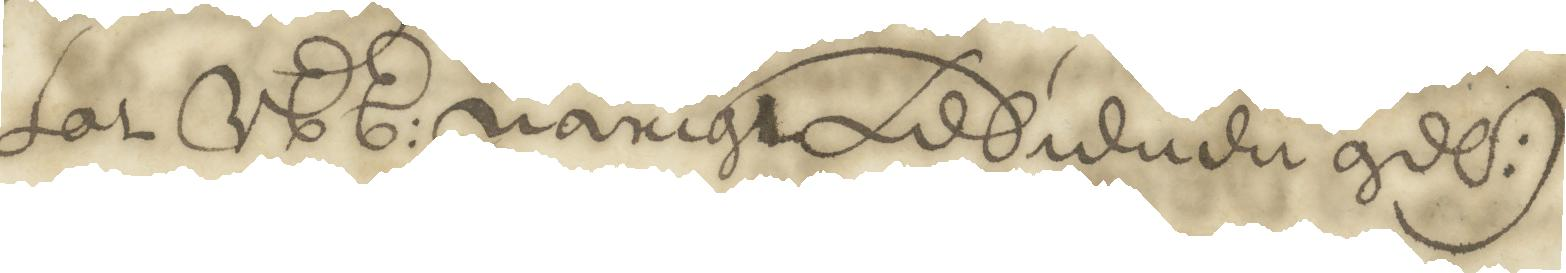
tot VEE: narigt tedienen gelijk
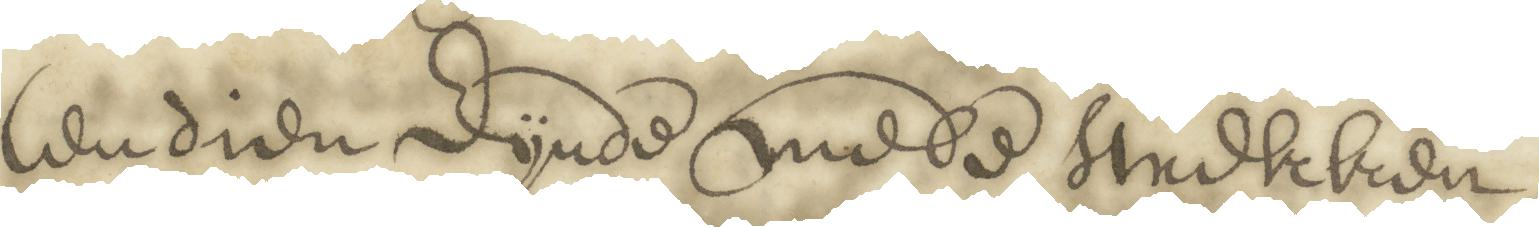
ten dien Eijnde mede strekken
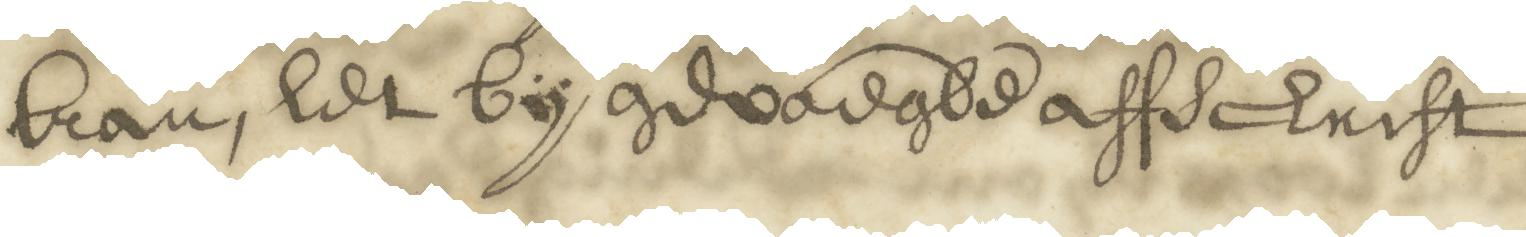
kan, het bij gevoegde affschrift
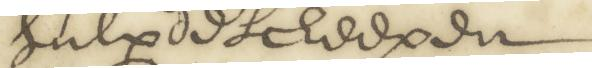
sulx de scheepen
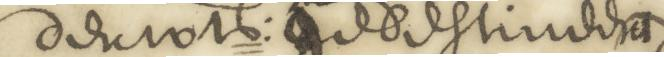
derw=is: gedestineert
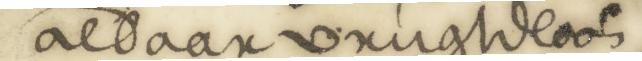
aldaar vrugteloos
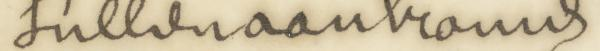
sullen aankomen
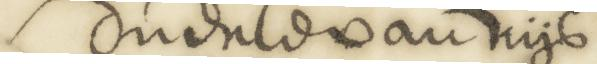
duerte van rijs
